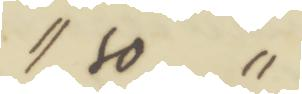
„ 10 „
